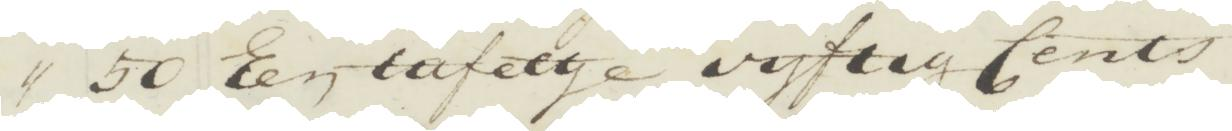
„ 50 Een tafeltje vyftig Cents
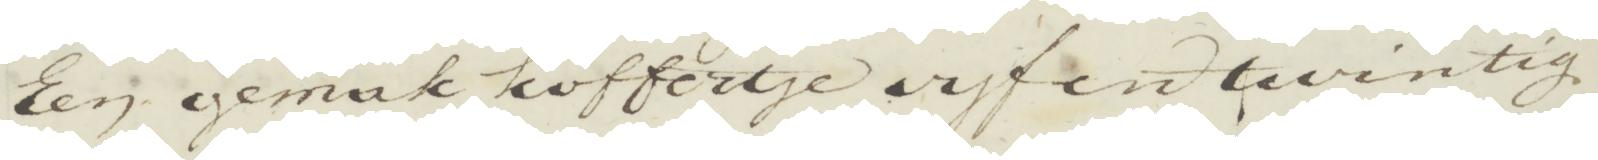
Een gemak koffertje vyf en twintig
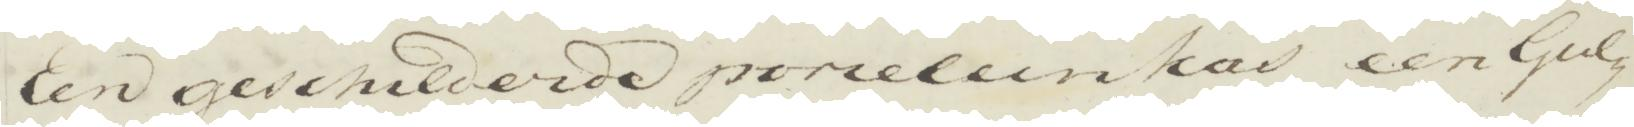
Een geschilderde porselein kas een Gul
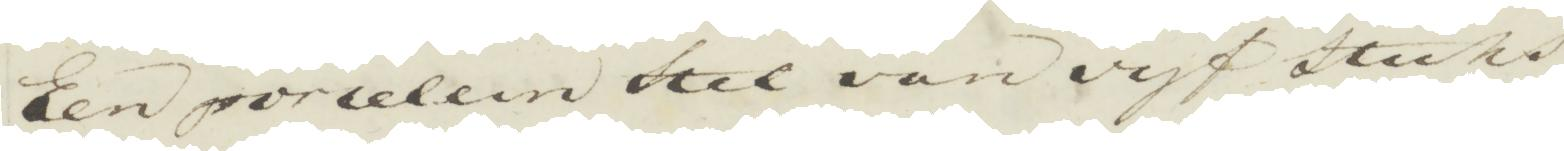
Een porselein stel van vyf stuks
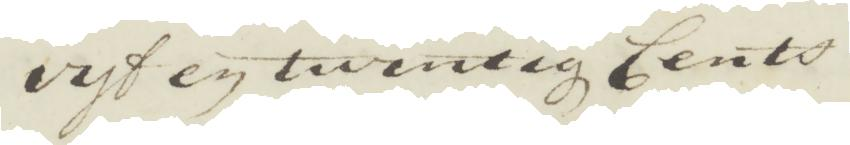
vyf en twintig Cents
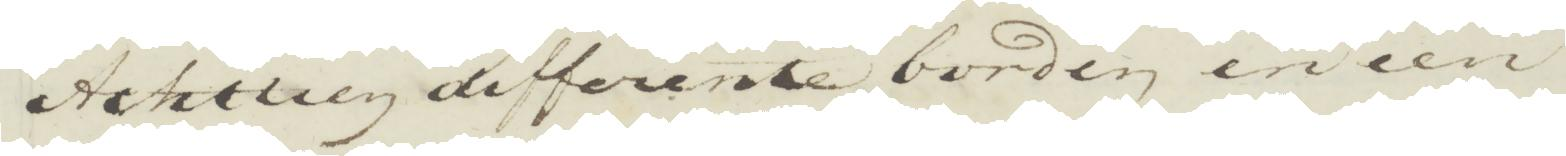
Achttien differente borden en een
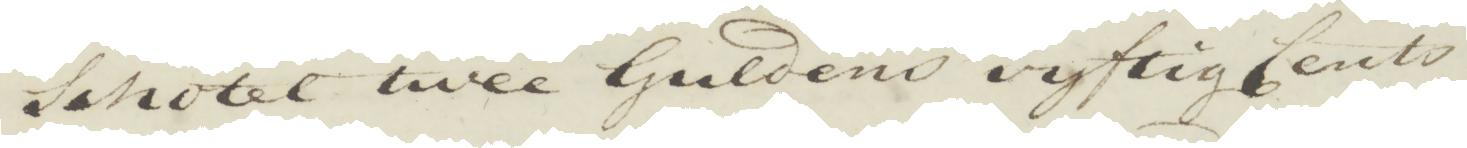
schotel twee Guldens vyftig Cents
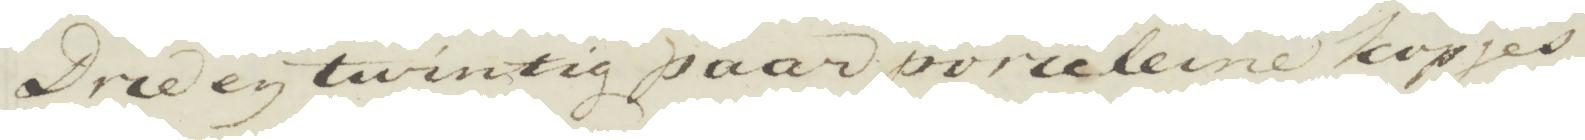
Drie en twintig paar porseleine kopjes
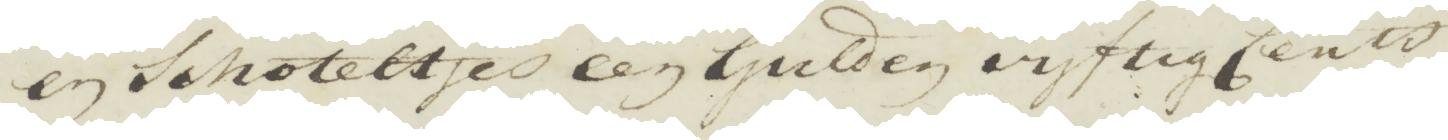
en schoteltjes een Gulden vyftig Cents
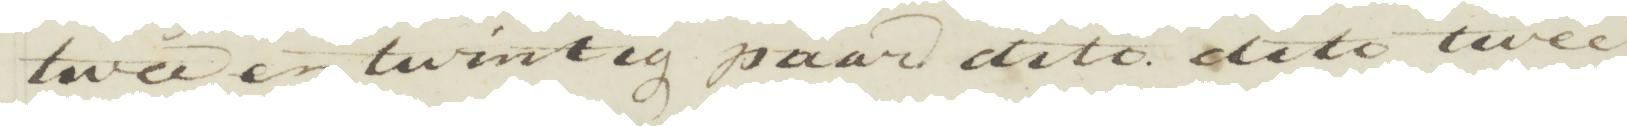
twee en twintig paar dito dito twee
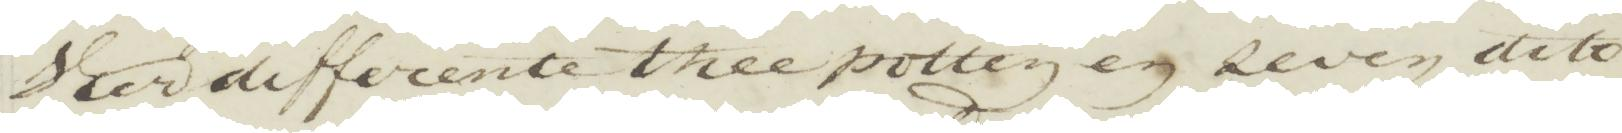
Vier differente thee potten en zeven dito
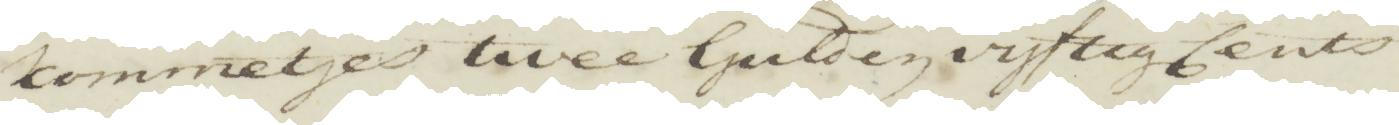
kommetjes twee Gulden vyftig Cents
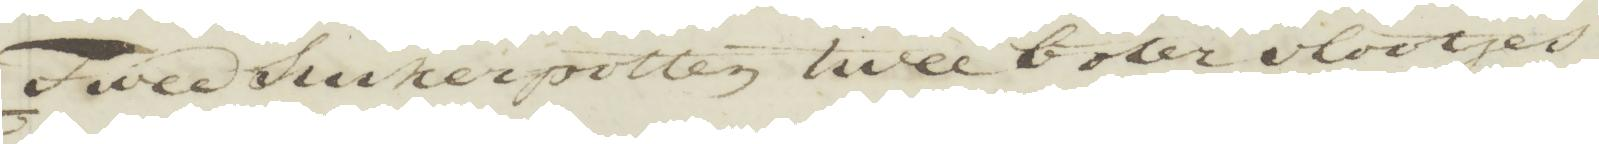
Twee suikerpotten twee boter vlootjes
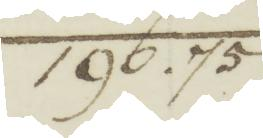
196.75
